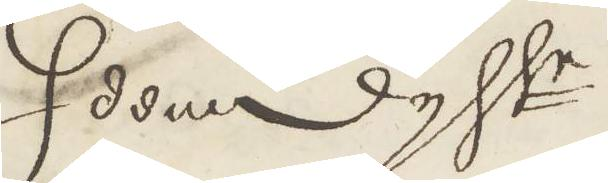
Jdem eyss=r
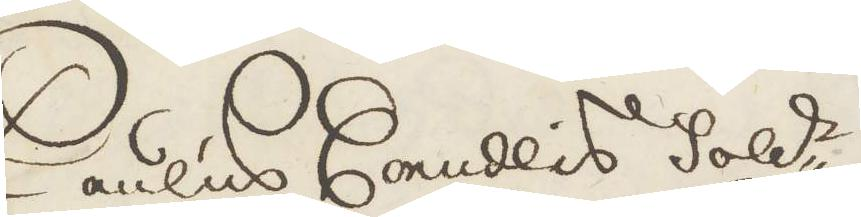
Paulus Coornelis sold„t
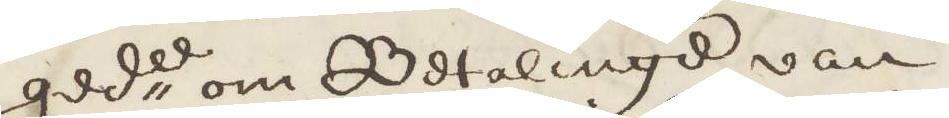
ged„e om Betalinge van
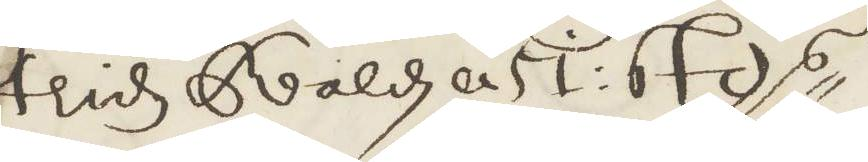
thien Realen a 51: stver„s
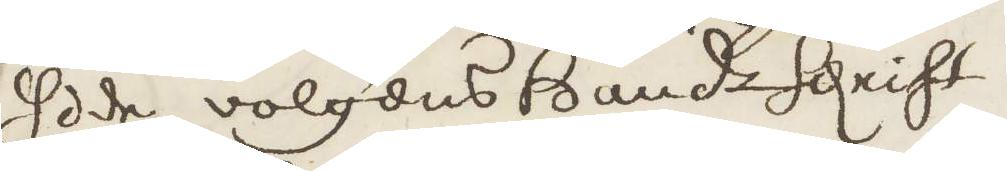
Jder volgens handtschrift
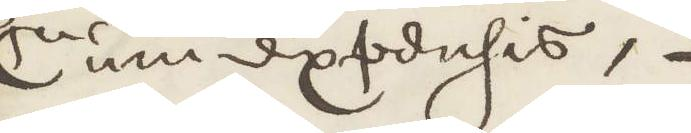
Cum expensis,
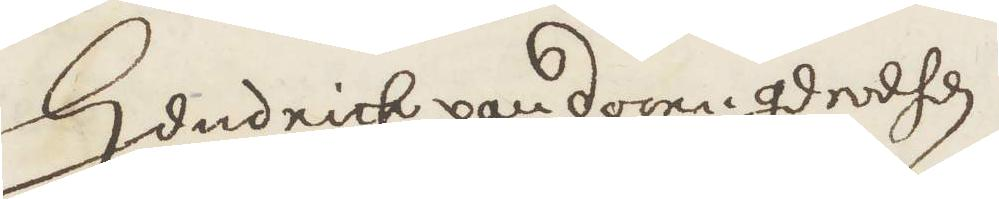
Hendrick van doorn gewesen
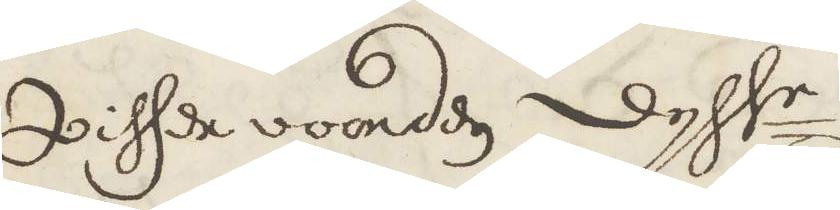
Visser voorden eyss=r
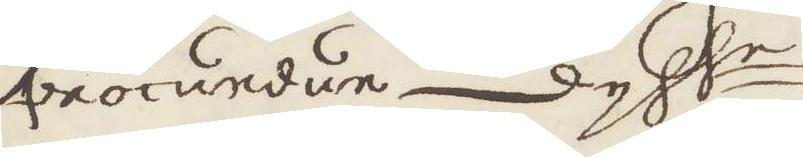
procureur eyss=r
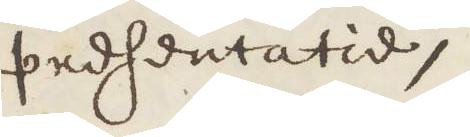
presentatie,
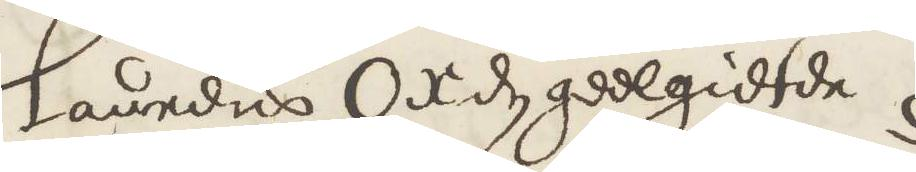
Laurens Oxen geelgieter
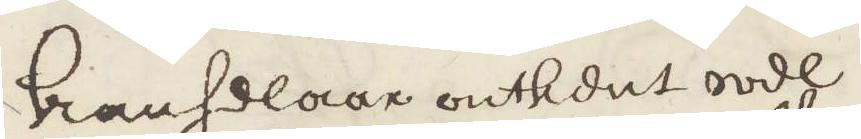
kanselaar ontkent wel
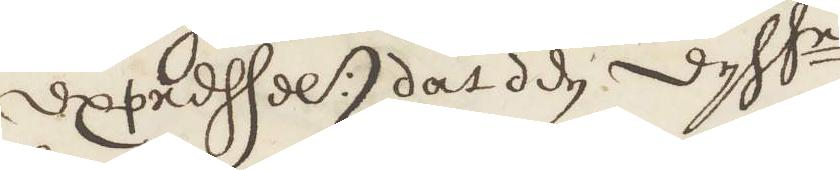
expresselijk dat den eyss=r
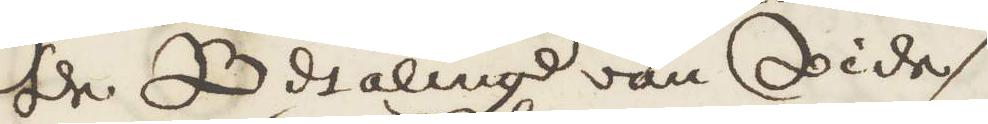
ter Betalinge van vier
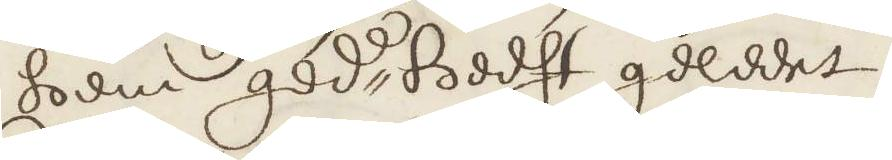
hem ged„e heeft geleert
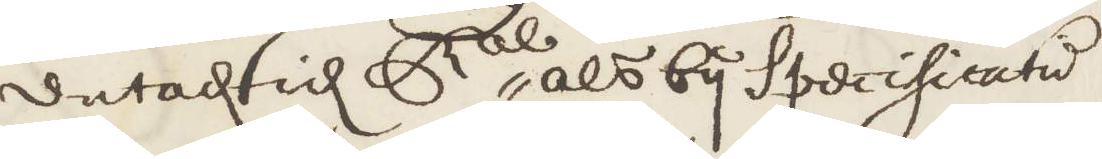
entachtich R„al als bij specificatie
